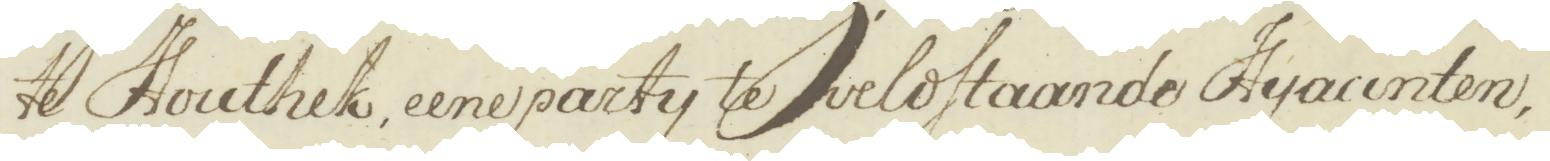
te Houthek, eene party te veldstaande Hyacinten,
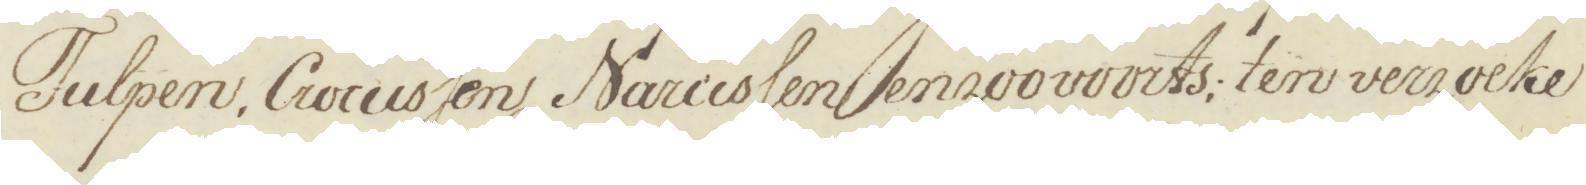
Tulpen, Crocussen, Narcissen enzoovoorts; ten verzoeke
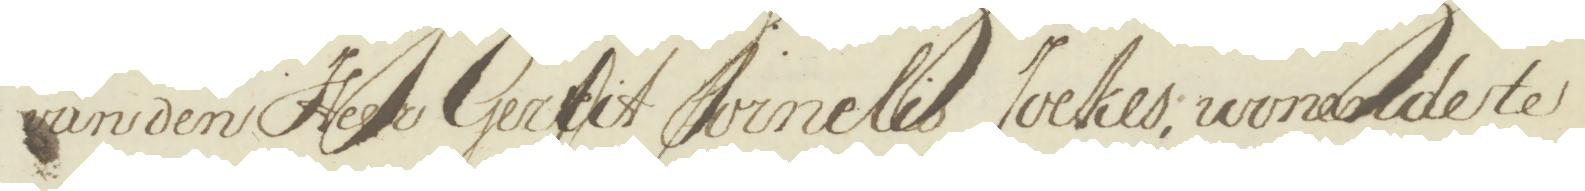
van den Heer Gerrit Cornelis Joekes, wonende te
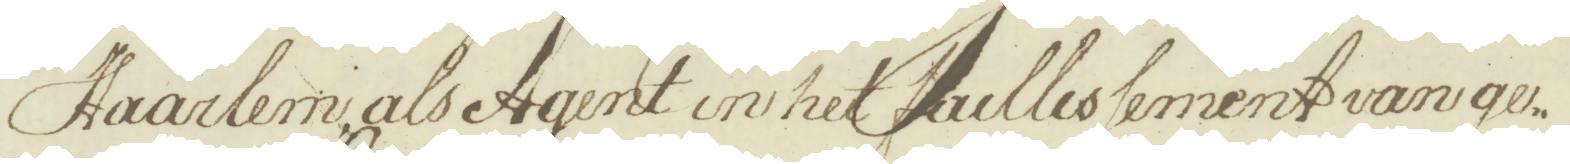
Haarlem als Agent in het faillissement van ge„
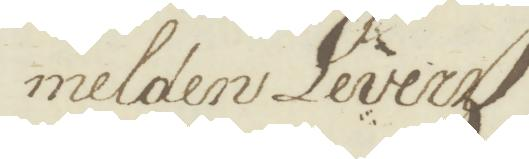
melden Leverz
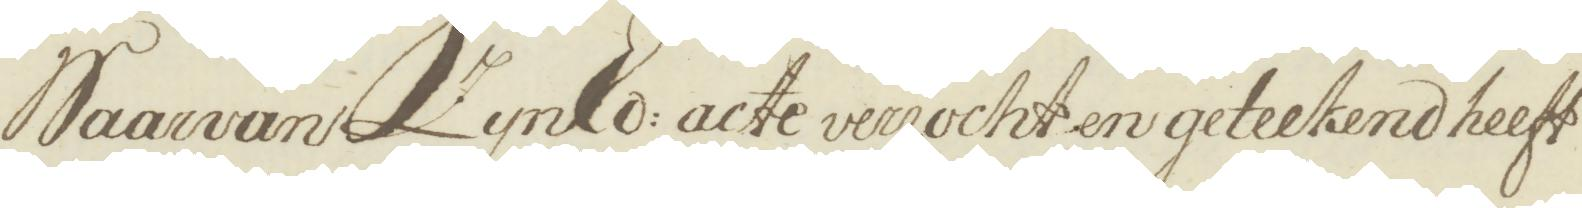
Waarvan Zijn Ed: acte verzocht en geteekend heeft
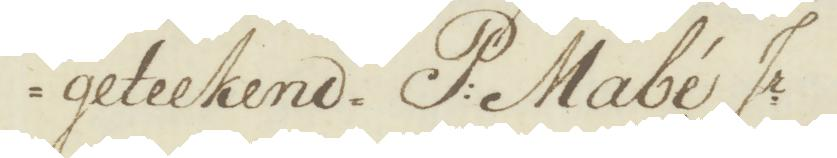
„geteekend. P: Mabé J=r
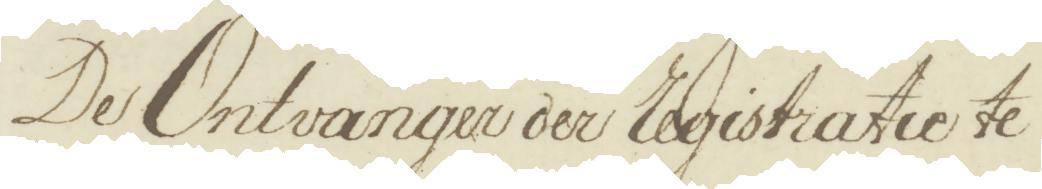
De Ontvanger der Registratie te
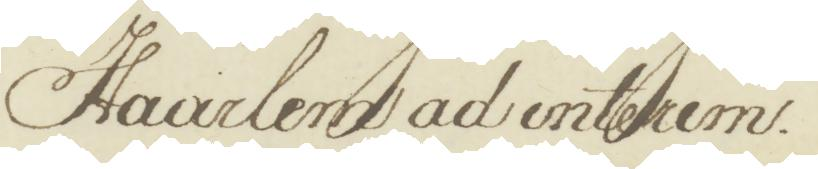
Haarlem ad interim.
